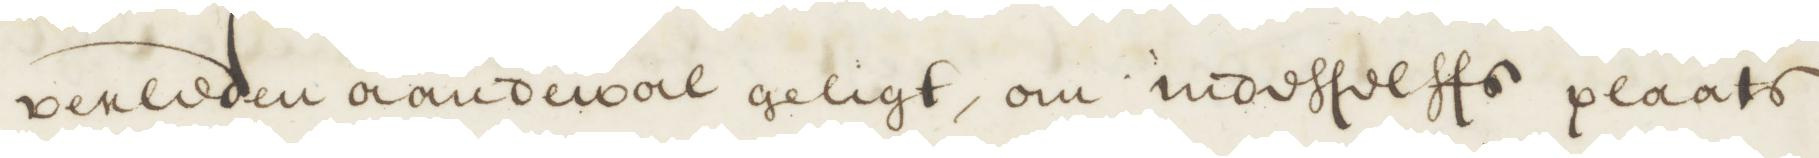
verleden aan de wal geligt, om in desselffs plaats
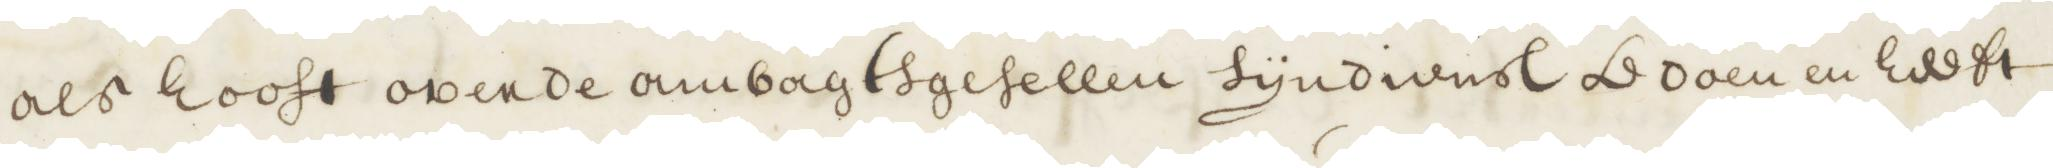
als hooft over de ambagtsgesellen sijn dienst te doen en heeft
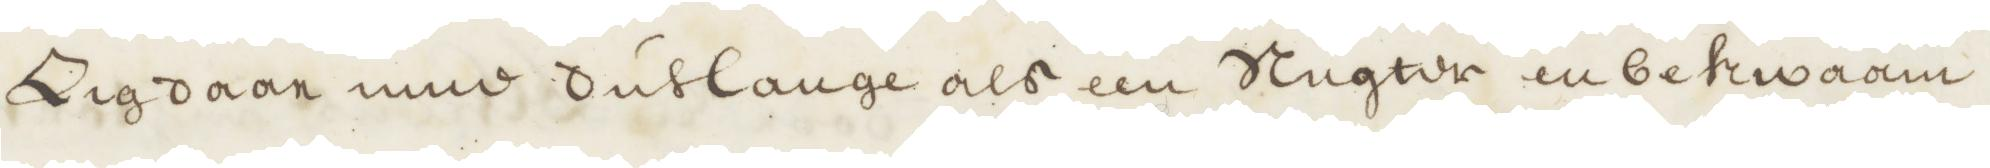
zig daar inne dus lange als een Nugter en bekwaam
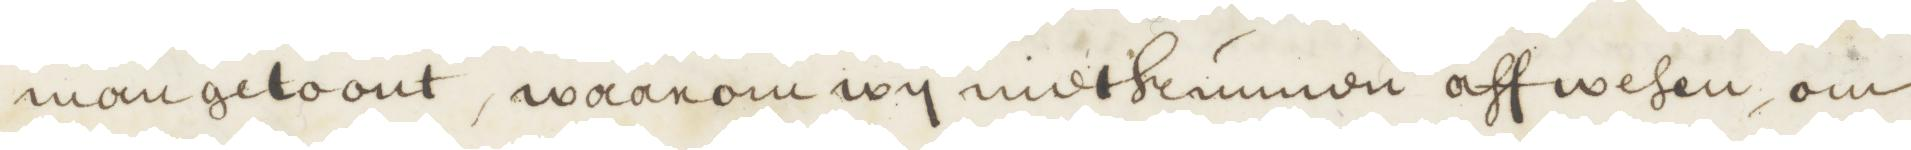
man getoont, waarom wij niet kunnen aff wesen, om
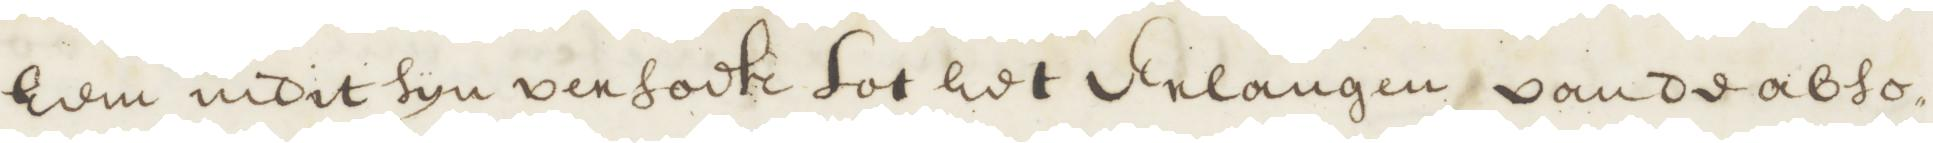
hem in dit sijn versoek tot het Erlangen van de abso„
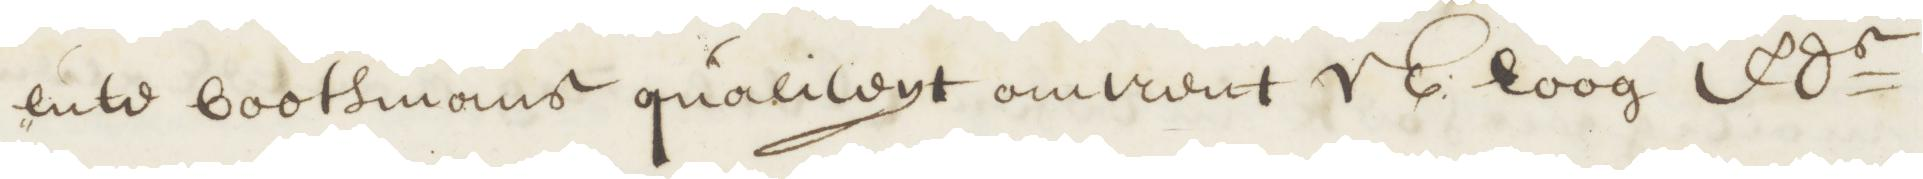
„lute bootsmans qualiteyt omtrent VE: hoog Ed=s
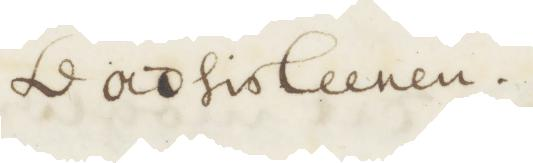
te adsisteeren.
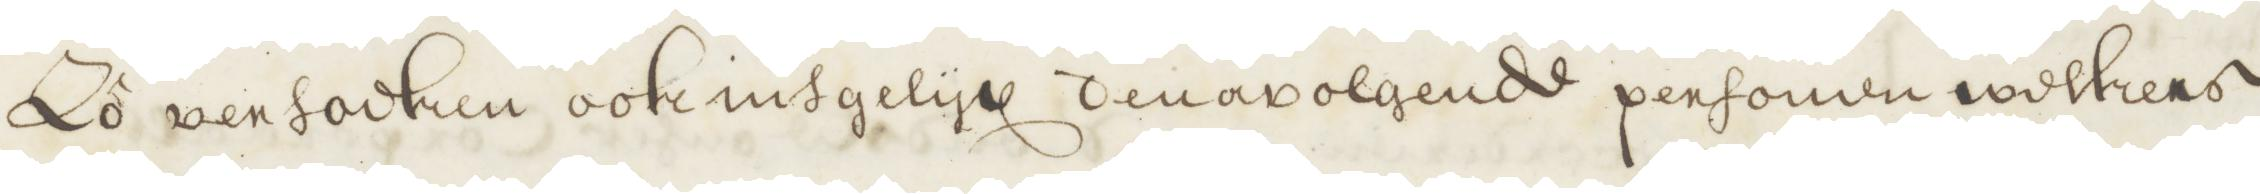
Zo versoeken ook insgelijx de navolgende personen welkers
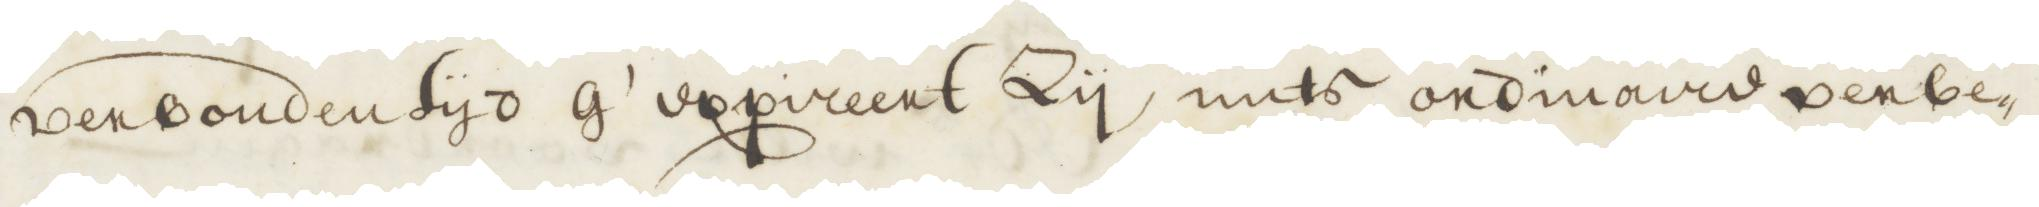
verbonden tijd g’expireert zij, mits ordinaire verbe„
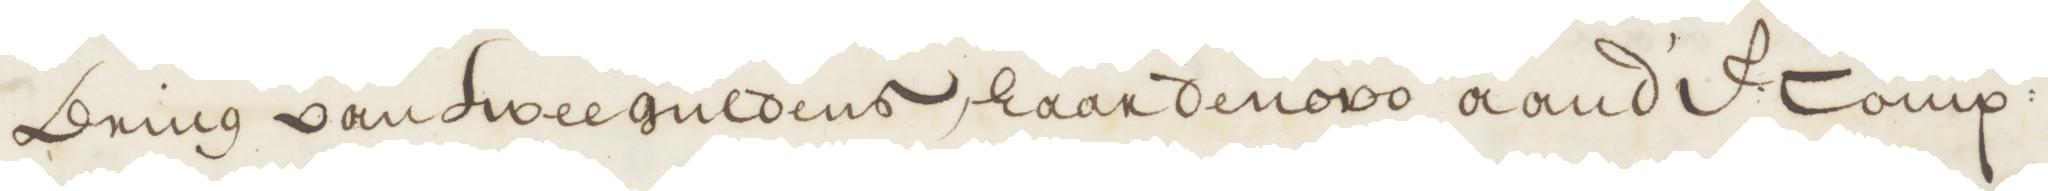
tering van twee guldens, haar denovo aan d’E: Comp:
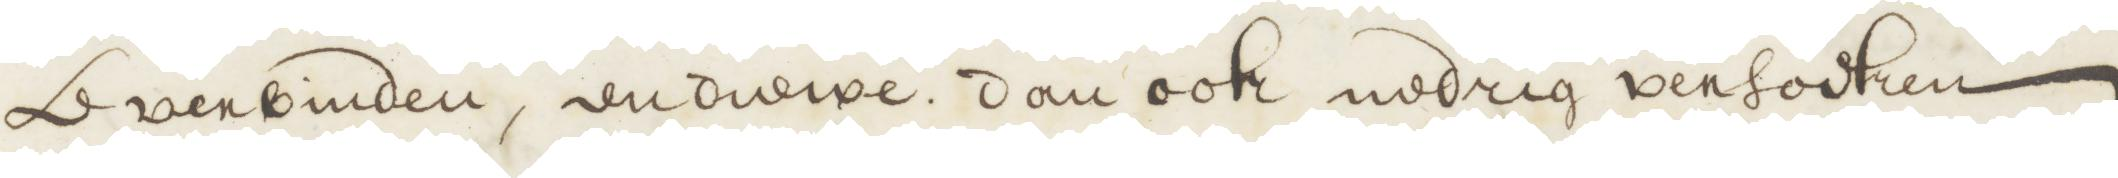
te verbinden, en diewe. dan ook nedrig versoeken
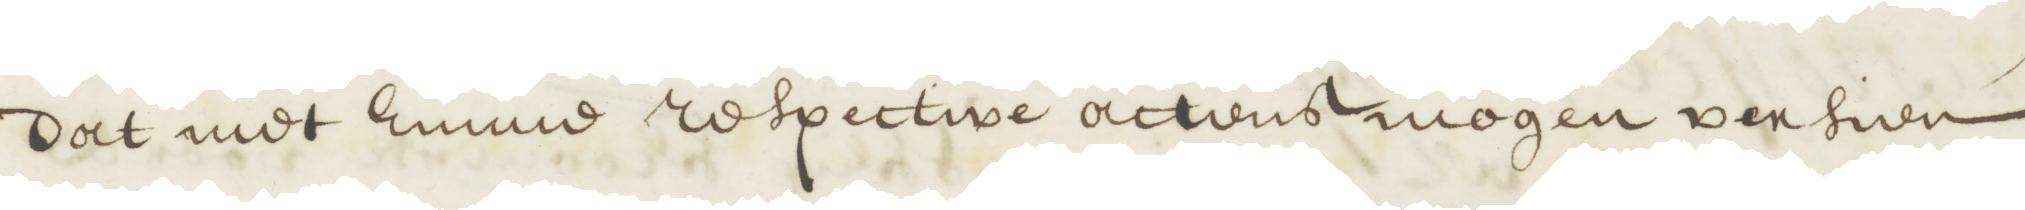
dat met hunne respective actens mogen versien
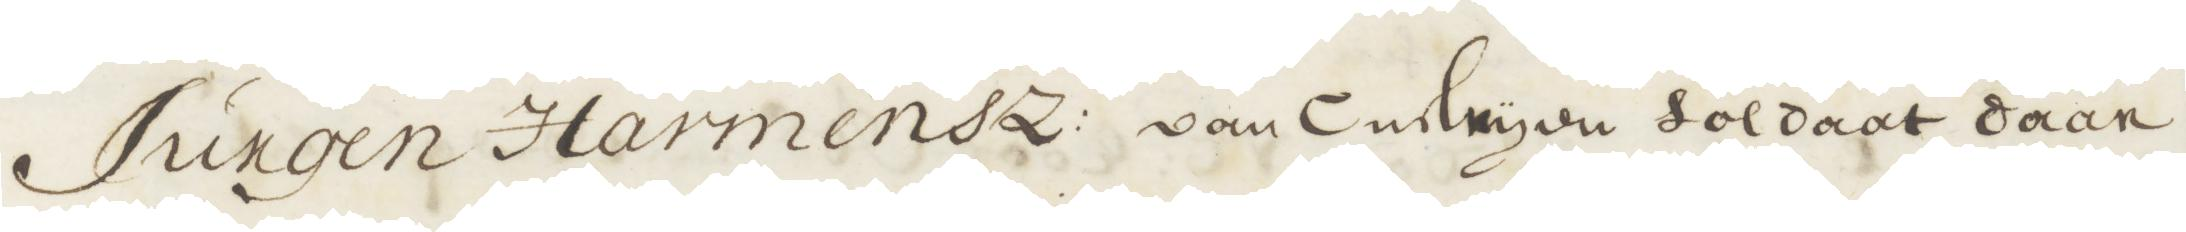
Iurgen Harmensz: van Custrijen soldaat daar
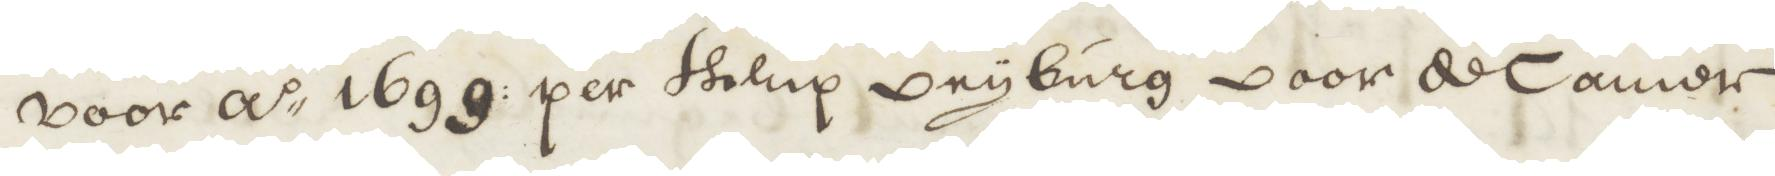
voor a„o 1699: per 't schip vrijburg voor de Camer
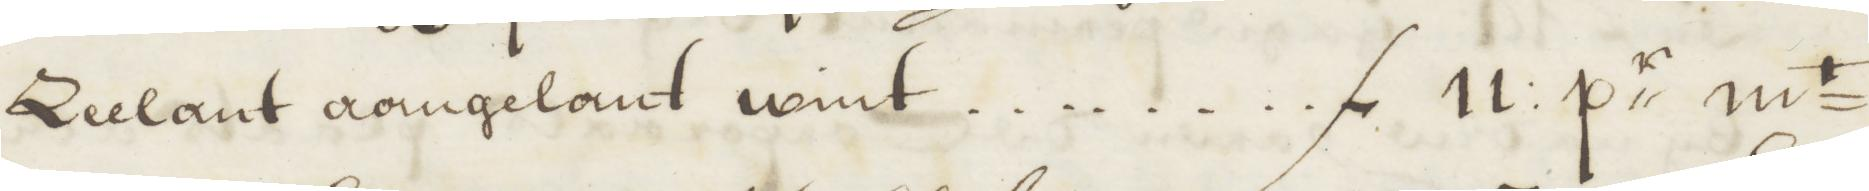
Zeelant aangelant wint . . . . . . . .ƒ 11: p„r m=t
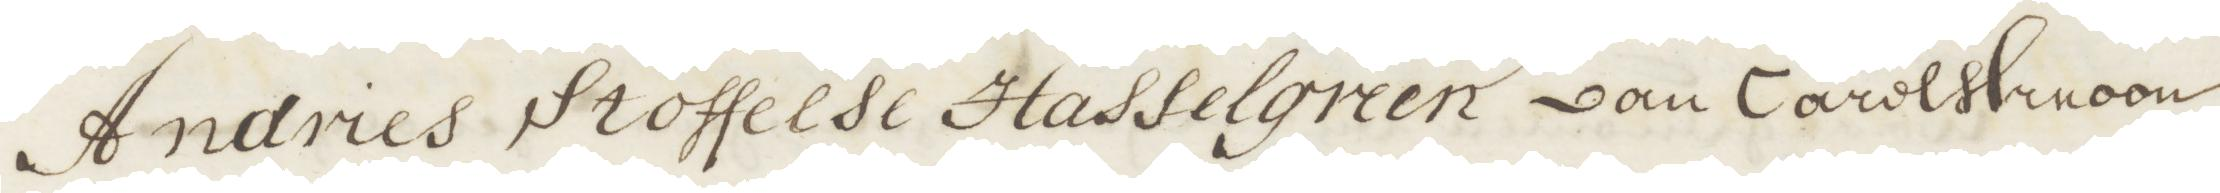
Andries Stoffelse Hasselgreen van Carelskroon
